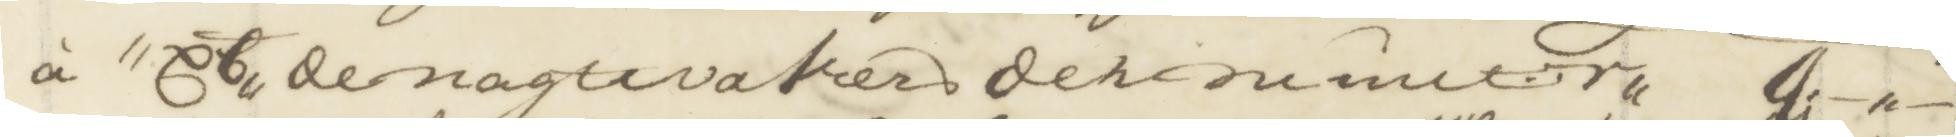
à "xb„ de nagtwakers der munt v„ 4.-„-
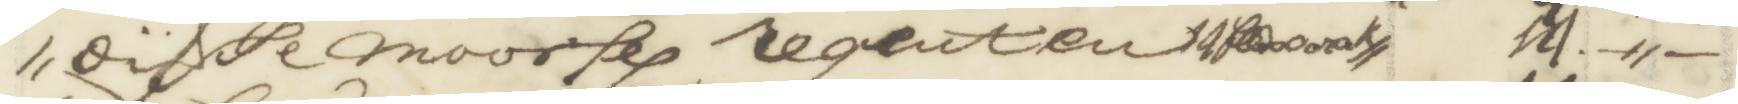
„diverse moorse regenten 14 flessenarak„ 14.-„-
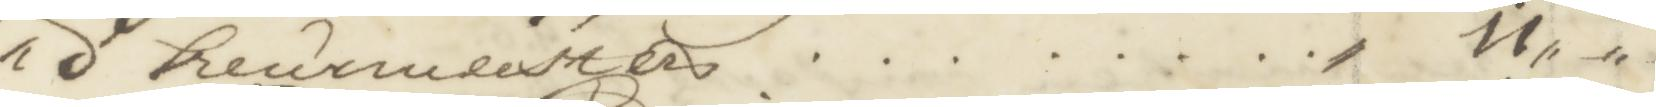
d' keurmeester . . . . . . . . „ 11„ „
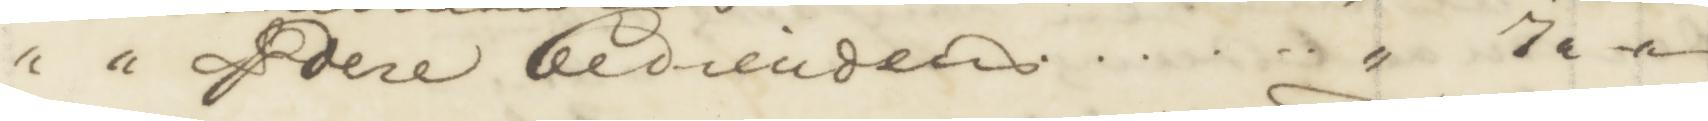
„ „ overdere bedienden. . . . . . „ 7„-„-
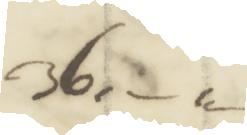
36,-„
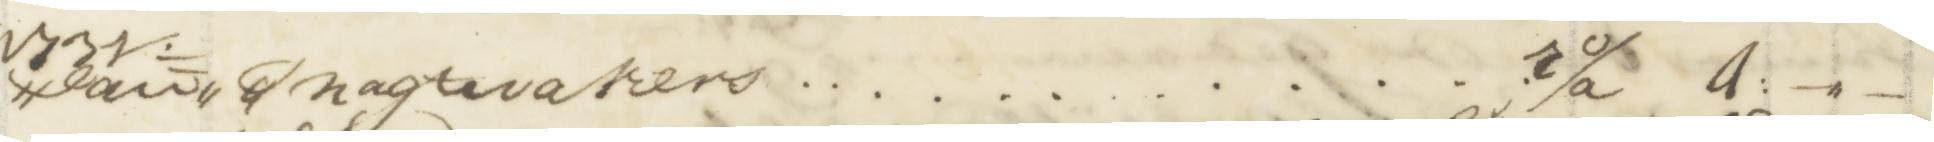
1731; „Ian„ d nagtwakers .. . . . . . . . . . . ro/a 4: –„ –
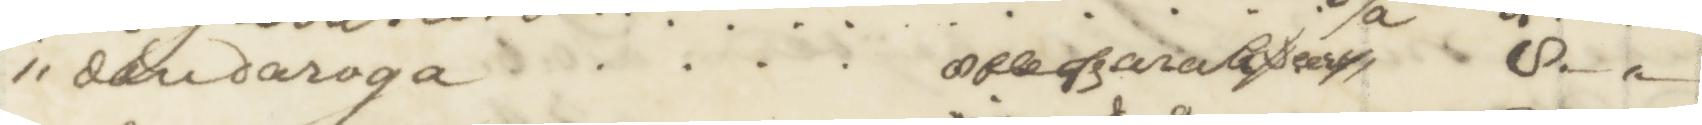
„den daroga . . . . .8flessenarak vereert„ 8.–„–
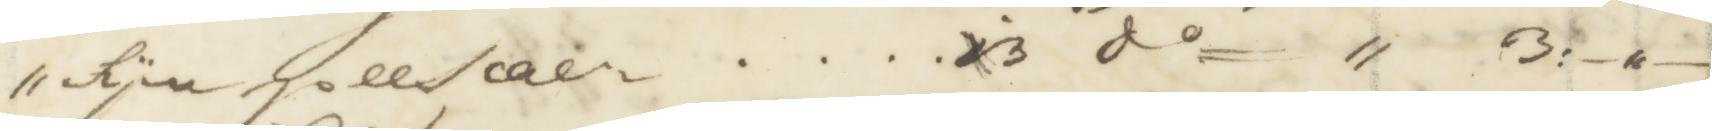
„sijn jollsaer . . . . 13 d=o „ 3:– „–
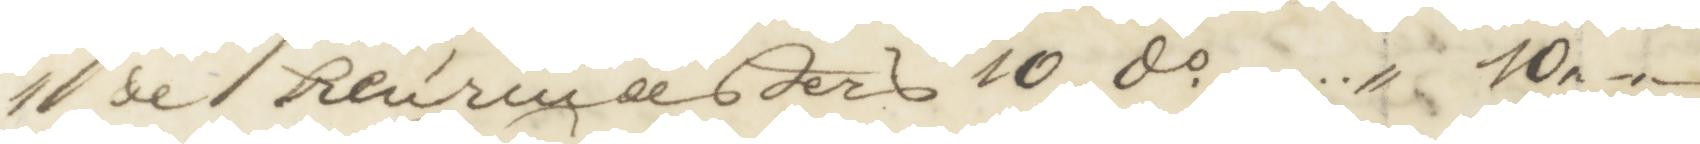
„ de keurmeester 10 d.o ..... „ 10„–,–
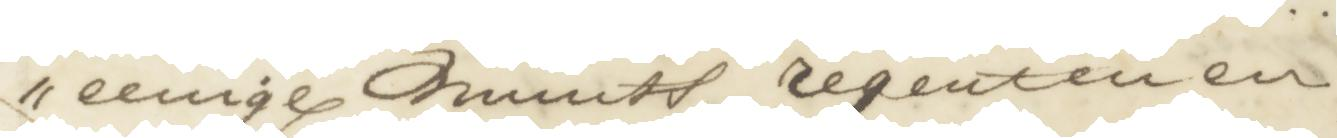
„ eenige munts regenten en
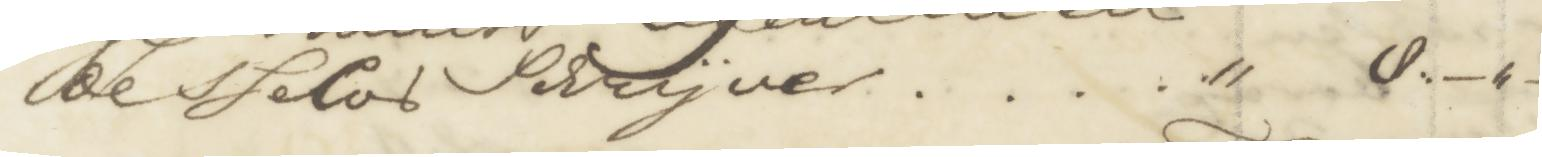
desselvs Schrijver . . . . „ 8:–„–
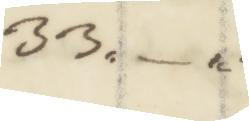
33„–„
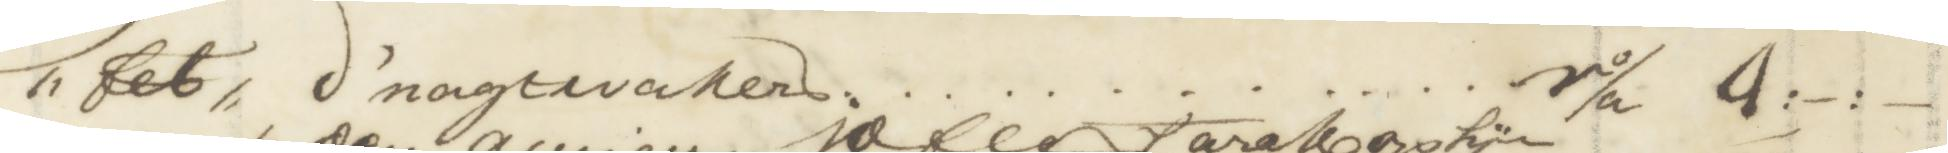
„ feb„ d’ nagtwakers: . . . . . . . . . . . . ro/a 4:–:–
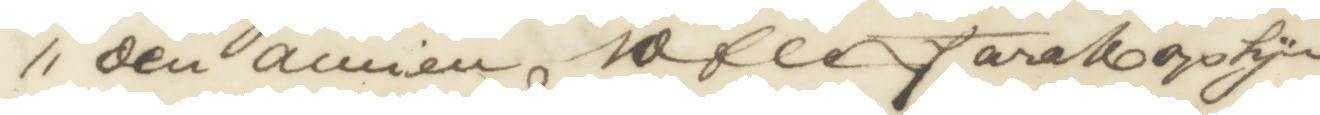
„ den amien, 10flesarak op sijn
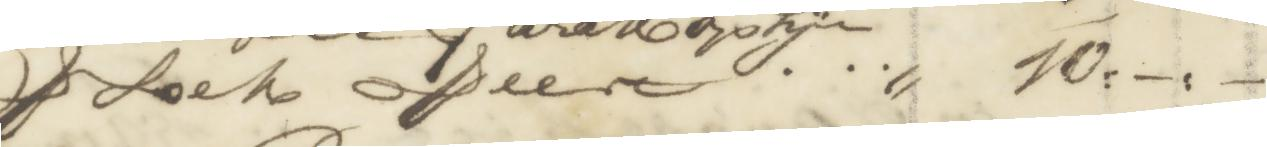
versoek vereert . . .„ 10:–.–
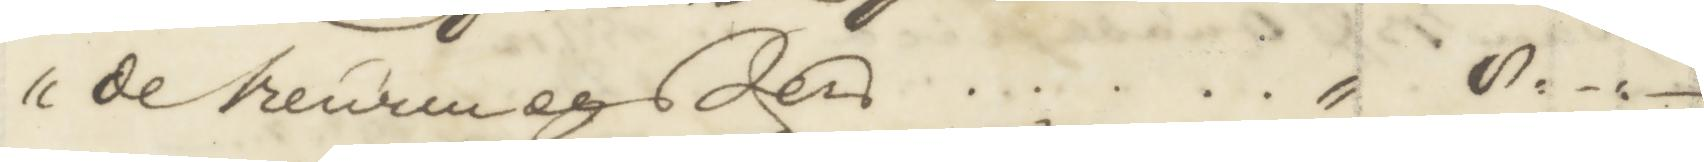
de keurmeester . . . . . „8:-„–
